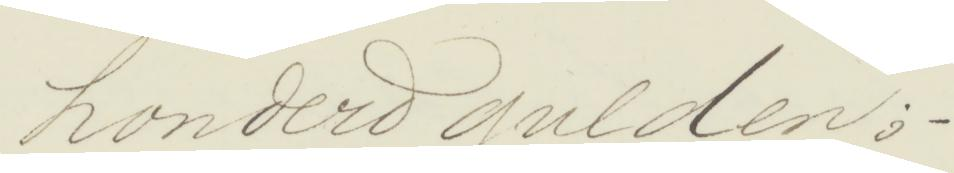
honderd gulden;-
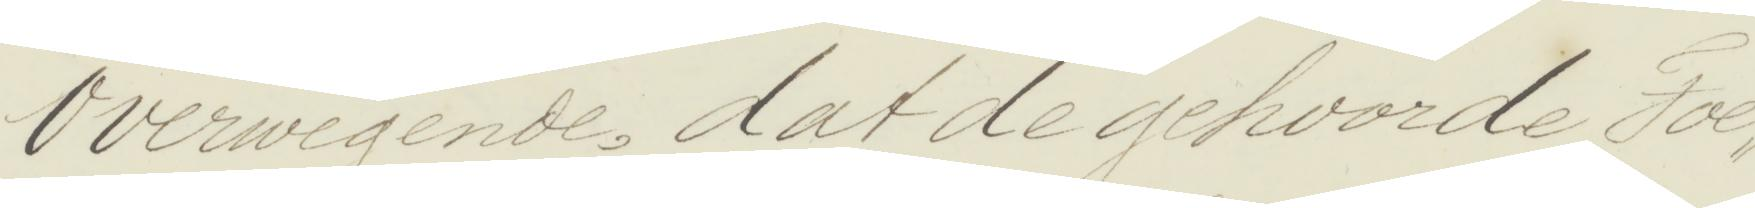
Overwegende, dat de gehoorde Toe„
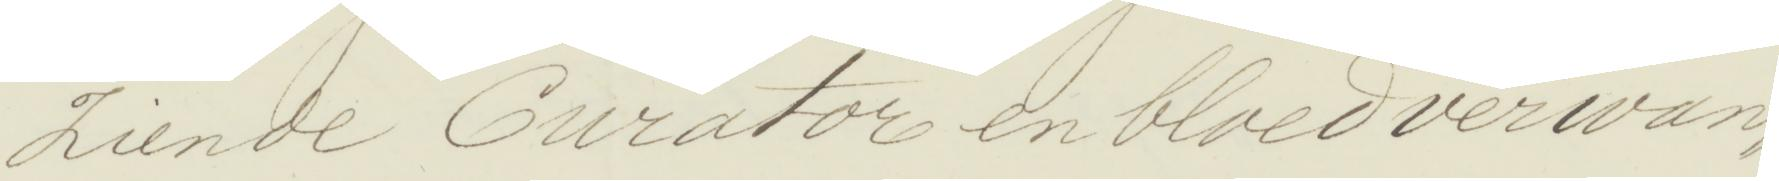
ziende Curator en bloed verwan„
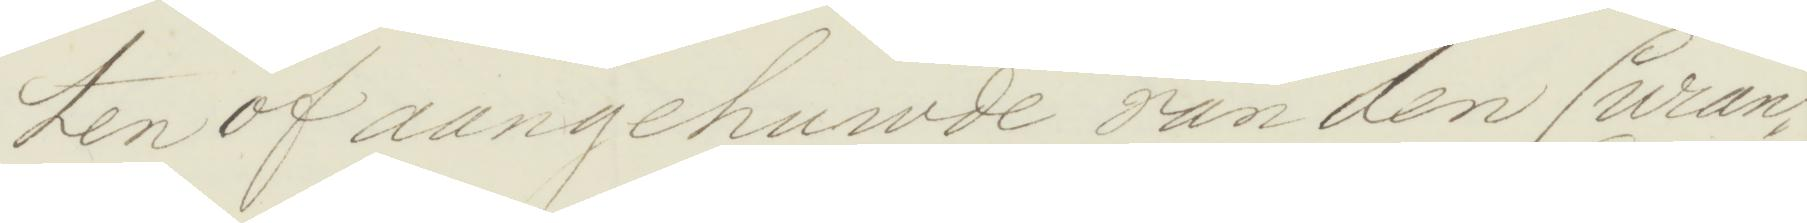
ten of aangehuwde van den Curan„
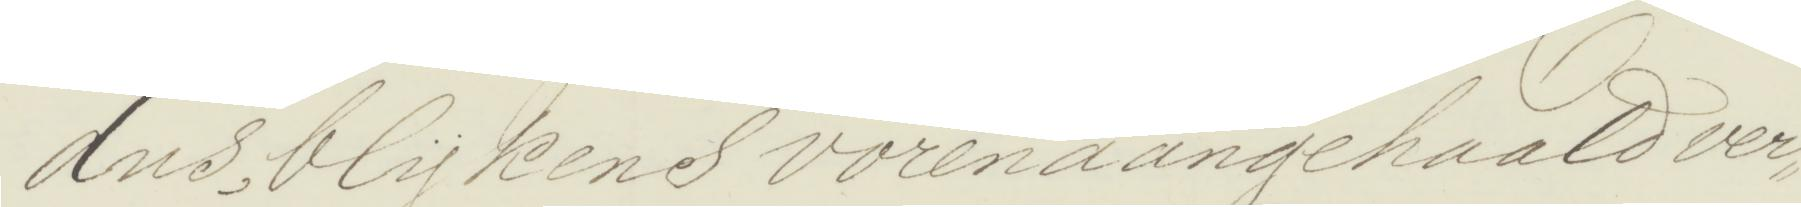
dus, blijkens voren aangehaald ver„
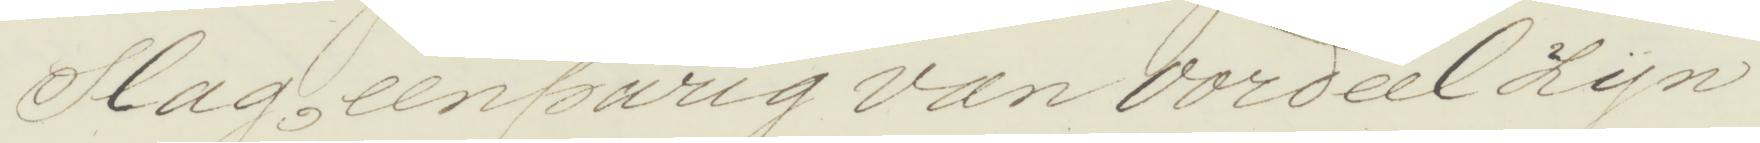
slag éénparig van oordeel zijn
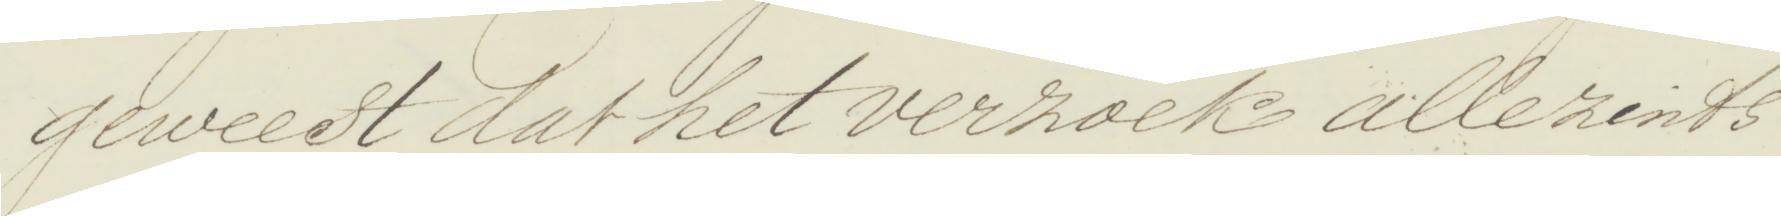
geweest dat het verzoek alle zints
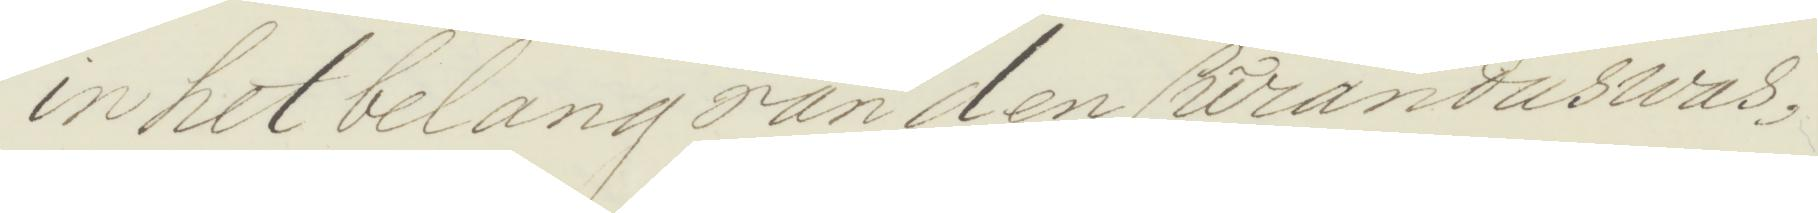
in het belang van den Curandus was„
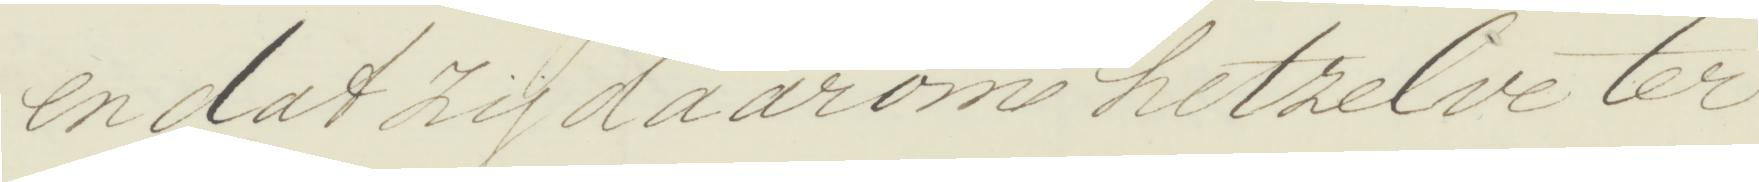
en dat zij dáárom hetzelve ter
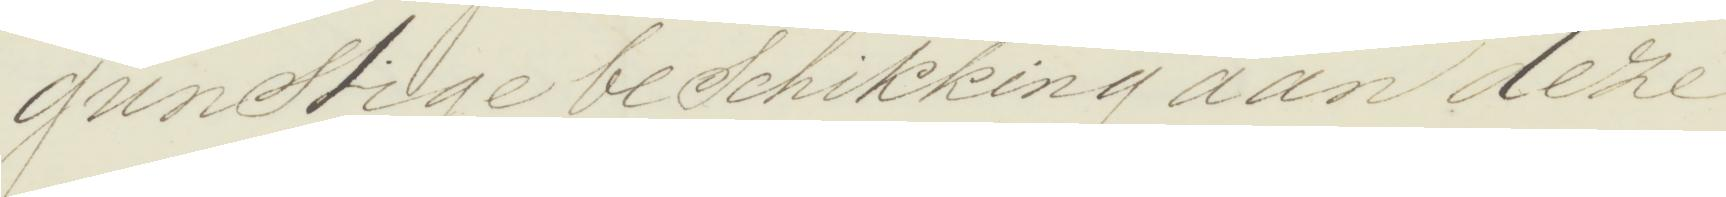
gunstige beschikking aan deze
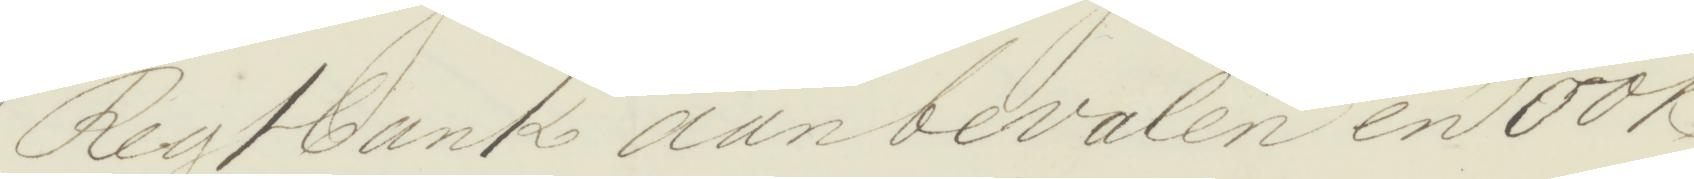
Regtbank aan bevalen en ook
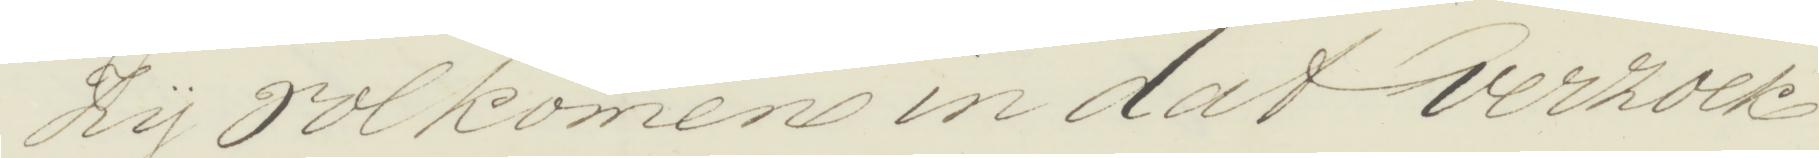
zij volkomen in dat verzoek
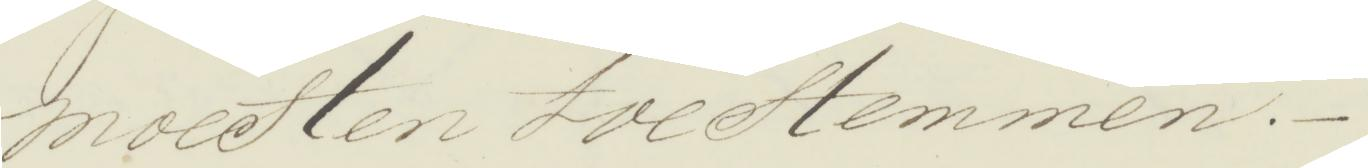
moesten toestemmen.-
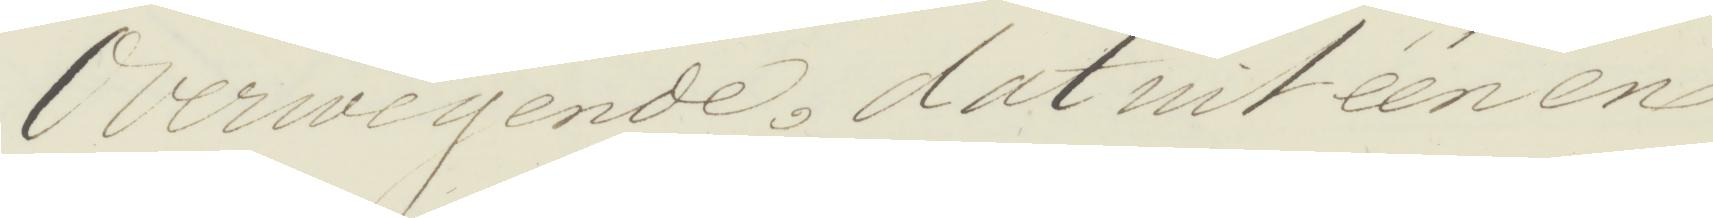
Overwegende, dat uit één en
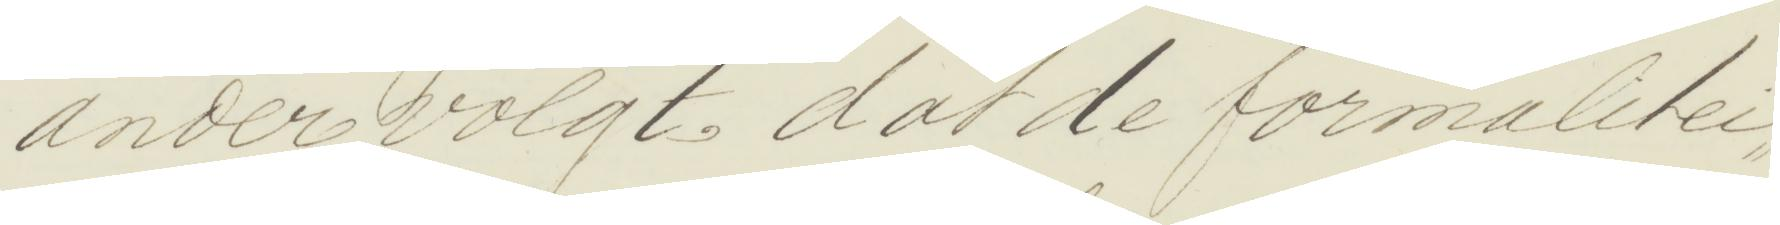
ander volgt dat de formalitei„
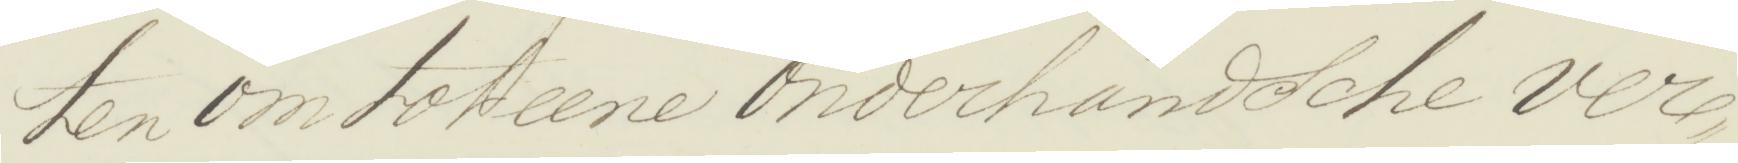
ten om tot eene onderhandsche ver„
